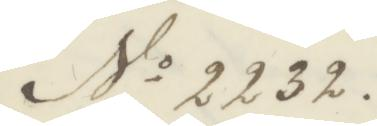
N-o 2232.
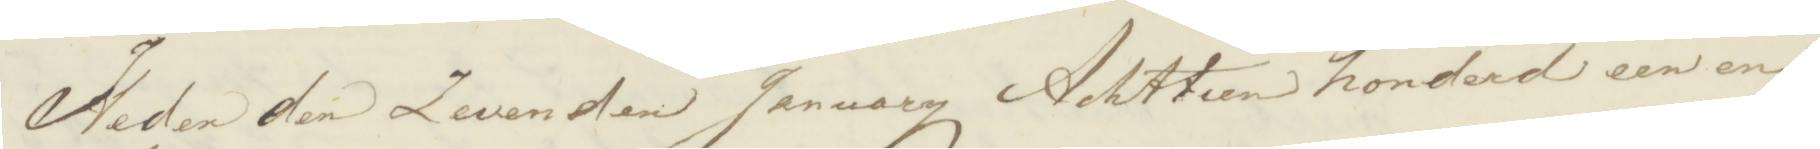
Heden den Zevenden January Achttien honderd een en
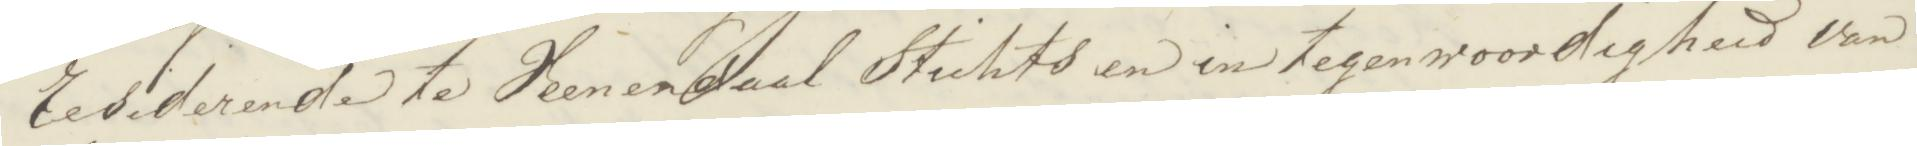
residerende te Veenendaal Stichts en in tegenwoordigheid van
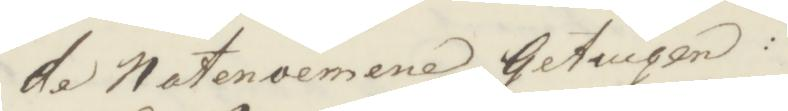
de Natenoemene Getuigen :
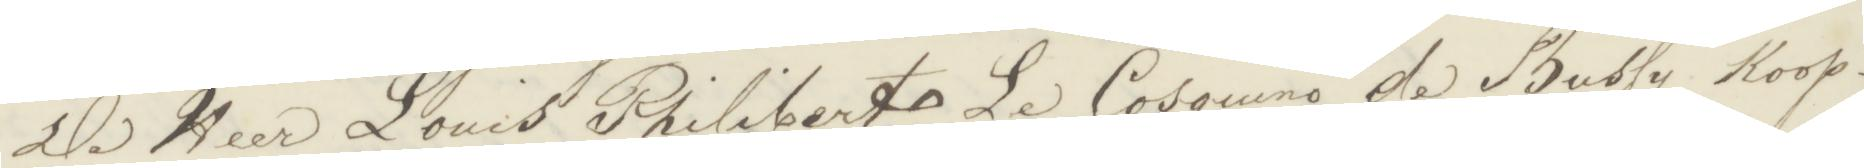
De Heer Louis Philibert Le Cosquino de Bussy koop
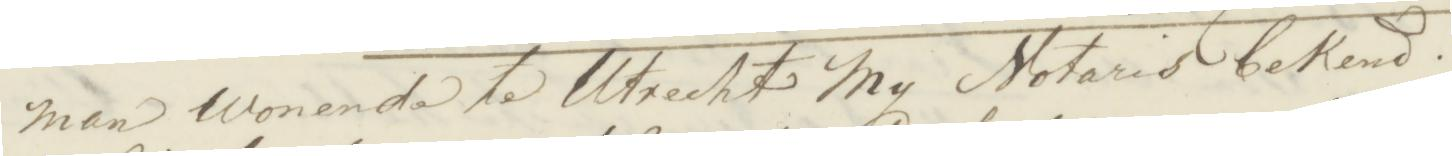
man wonende te Utreckt my Notaris bekend.
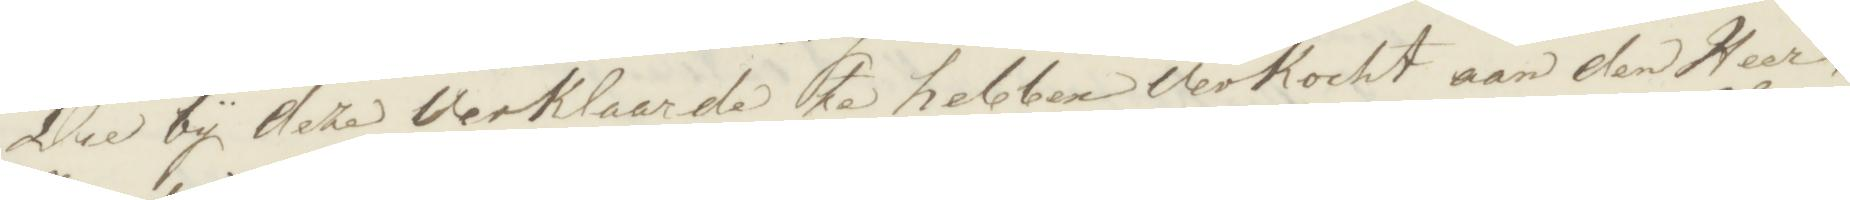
Die bij deze verklaarde te hebben verkocht aan den Heer
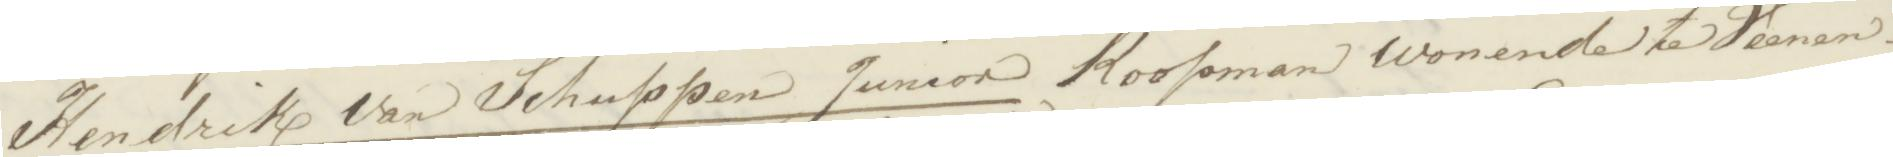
Hendrik van Schuppen Junior Koopman wonende te Veenen
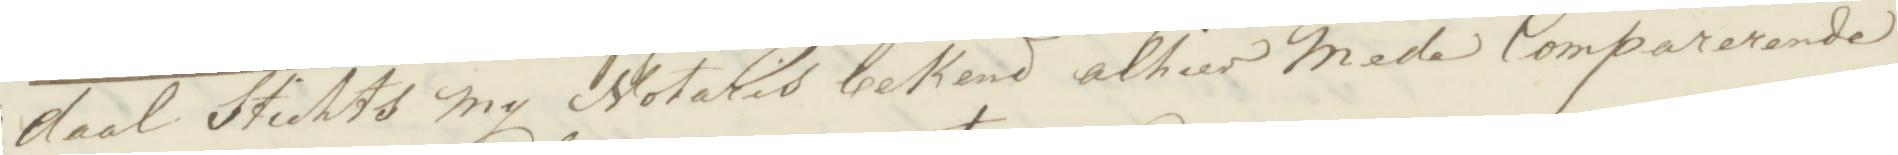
daal Stichts my Notaris bekend alhier mede Comparerende
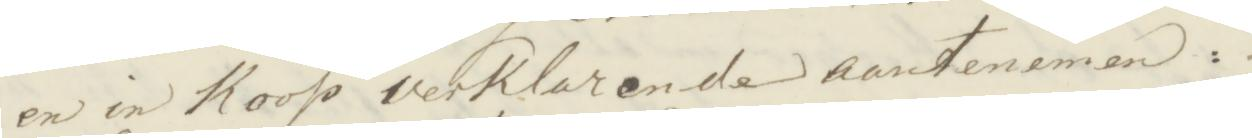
en in koop verklarende aantenemen:
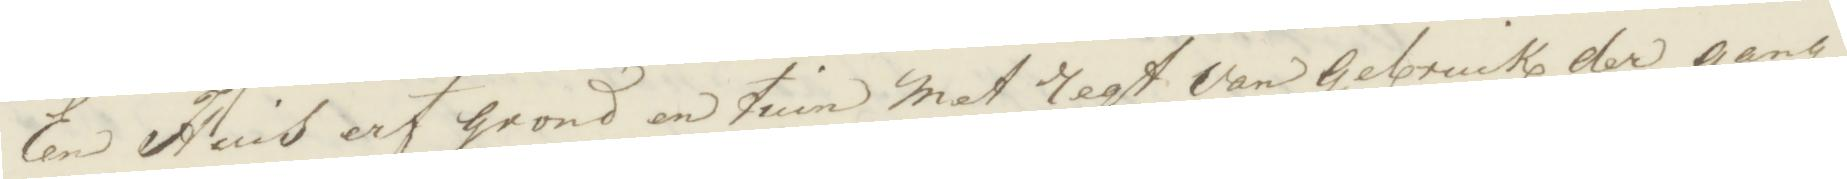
Een Huis erf Grond en tuin met regt van gebruik der gang
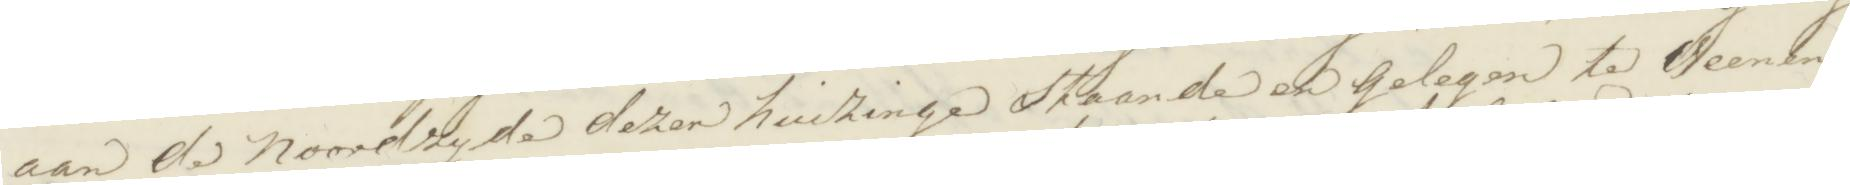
aan de Noordzyde dezer huizinge staande en gelegen te Veenen
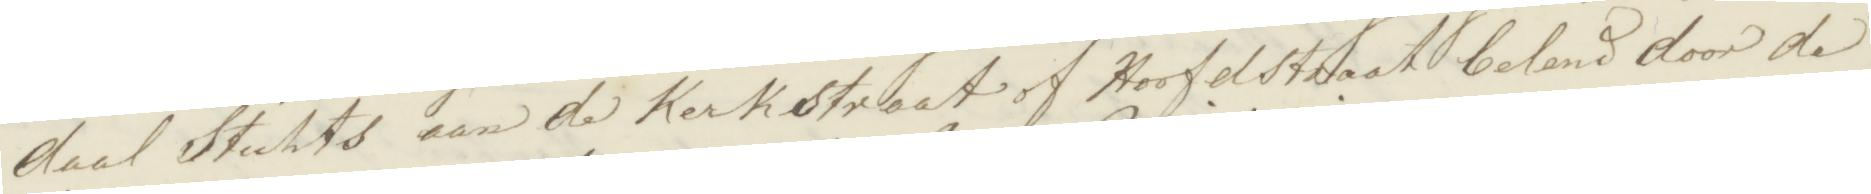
daal stichts aan de Kerkstraat of Hoofdstraat belend door de
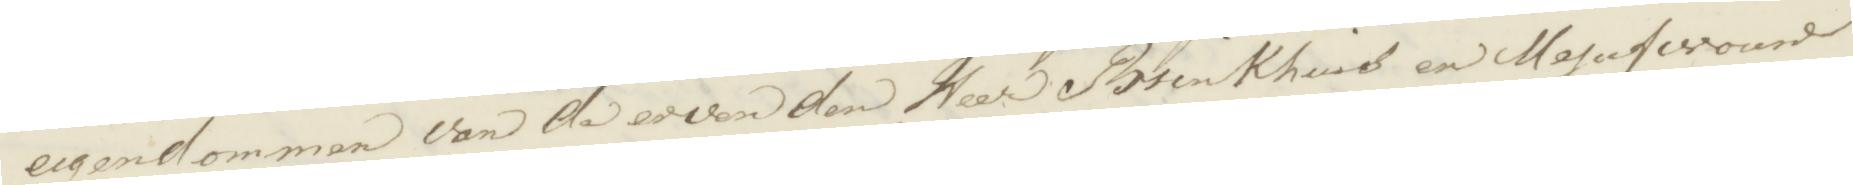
eigendomman van de erven den Heer Brinkhuis en Mejufvrouw
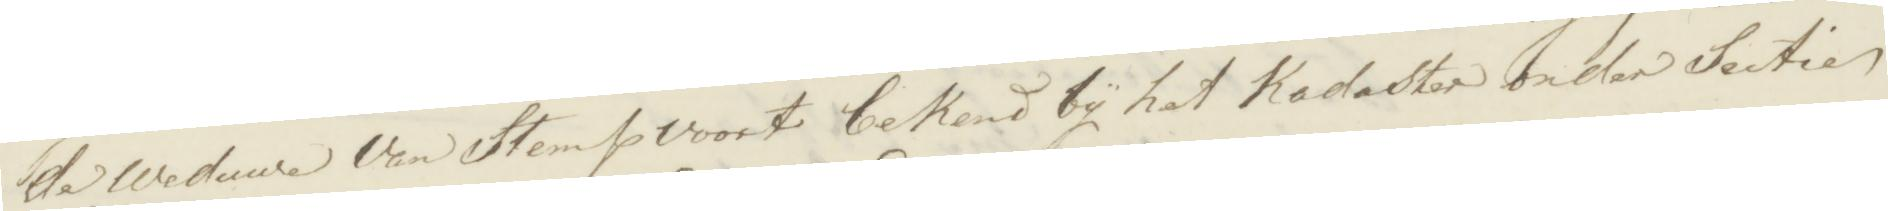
de weduwe van Stempvoort bekend bij het Kadaster onder Sectie
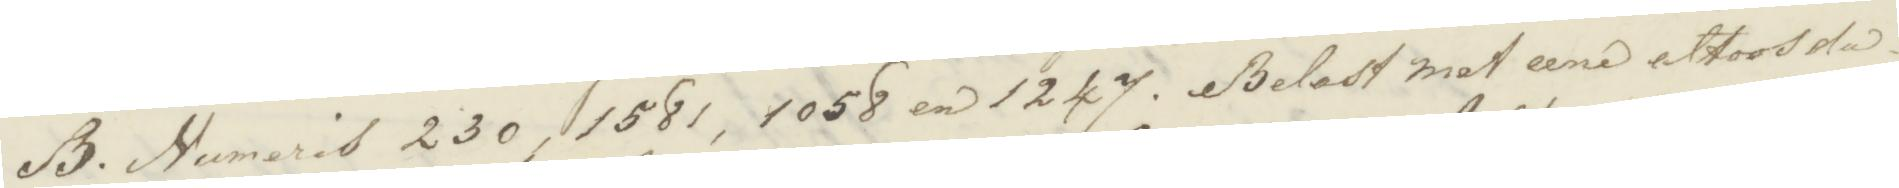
B. Numeris 230, 1581, 1058 en 1247. Belast met eene altoosdu
